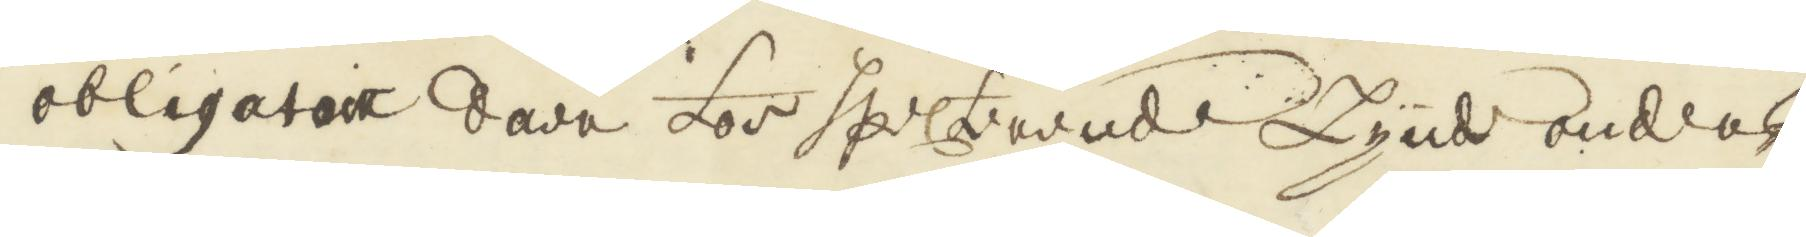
_:o obligatoir daer toe specterende zijnde onders„
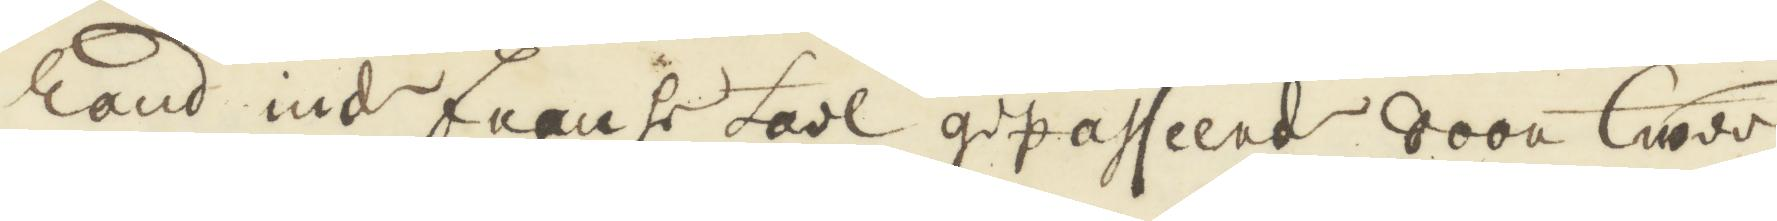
hand in de franse tael gepasseerde door twee
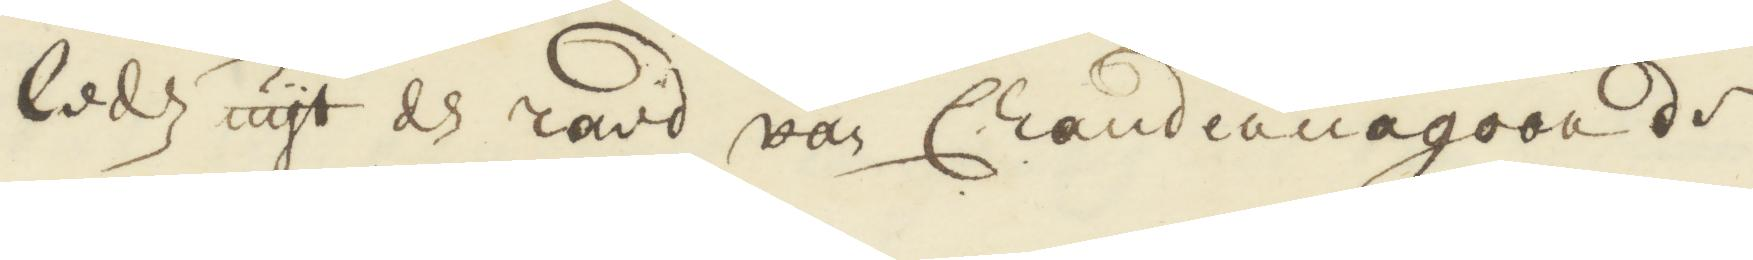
leden uijt den raed van Chandernagoor de
